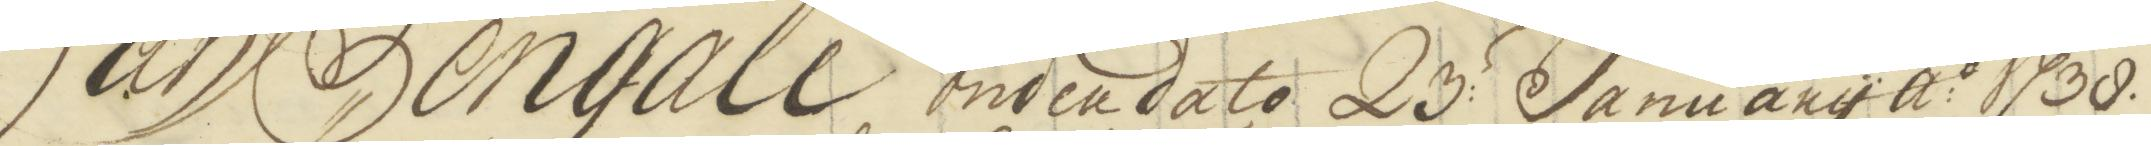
Van Bengale onder dato 23:' Januarij A:o 1738.
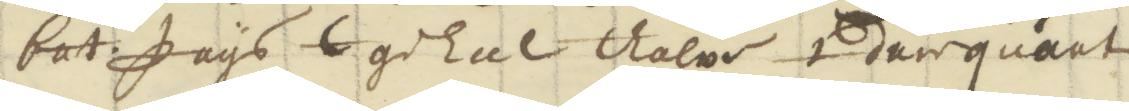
bat. prijs t geheel thalve t dair quart
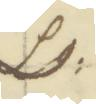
L:
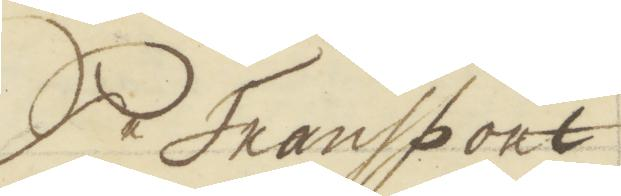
Pr Transport
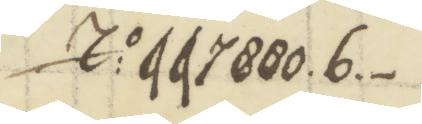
r:o 447880. 6. –
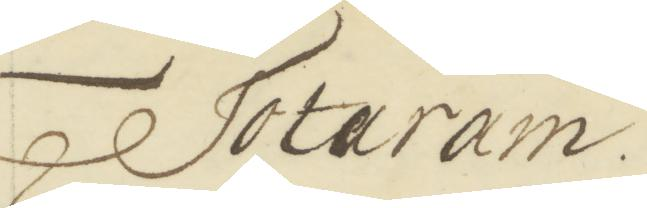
Totaram.
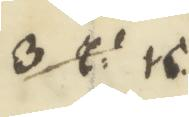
3 r:o 15
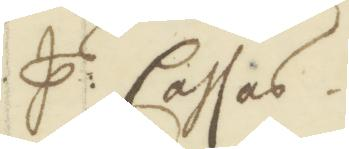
p:s Cassas
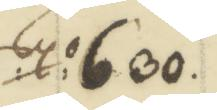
tp:s r:o 630.
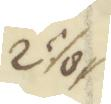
2 5/8„
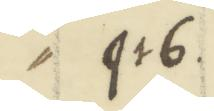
„ 416.
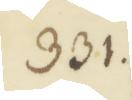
331
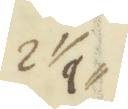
2¼„
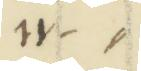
11 – „
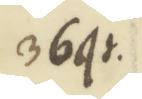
3641.
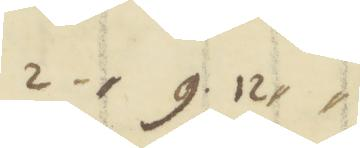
2 - „ 9. 12„ „
